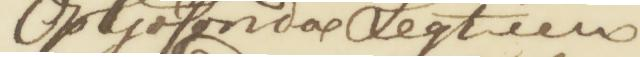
Op Goconda Legt een
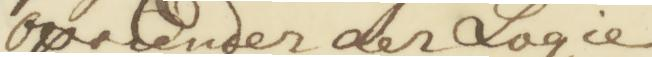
opsiender der Logie
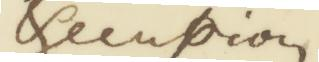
& een pion
